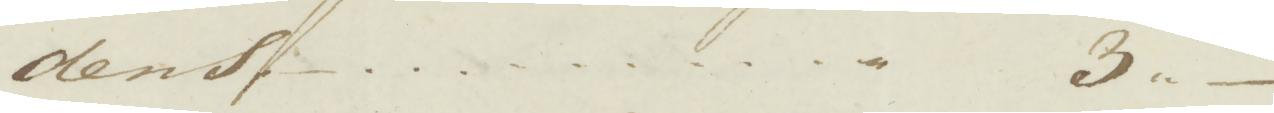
dens. 3 „-
